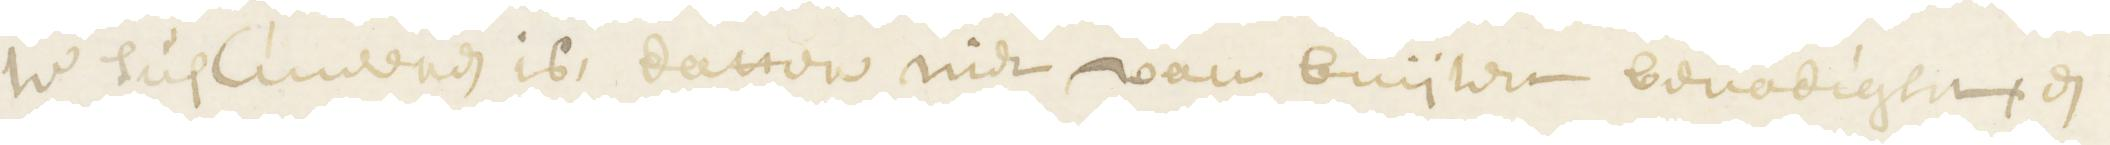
te sustineeren is, datter niet van buijten benodight, en
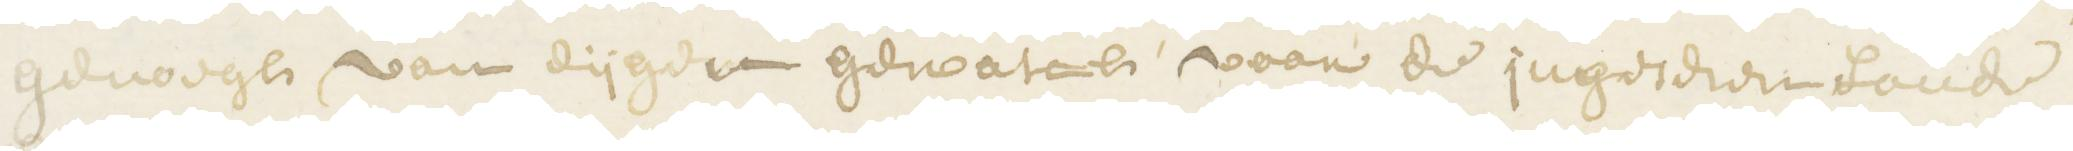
genoegh van eijgen gewasch voor de jngeseten soude
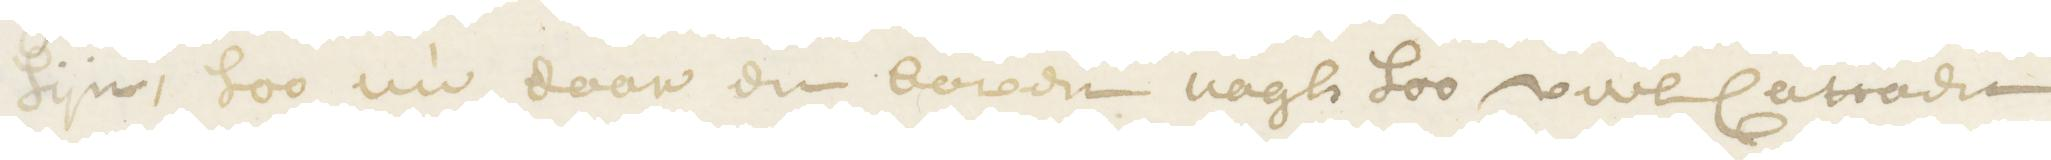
sijn, soo nu daar en boven nogh soo veel Cattoen
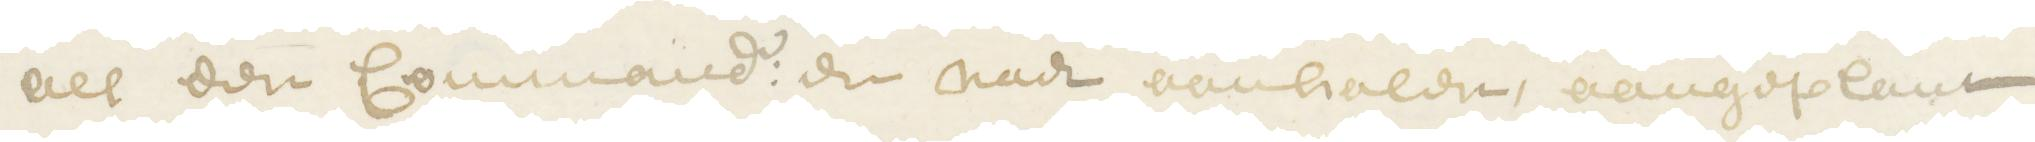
als den Command:r en naer aanhalen, aangeplant
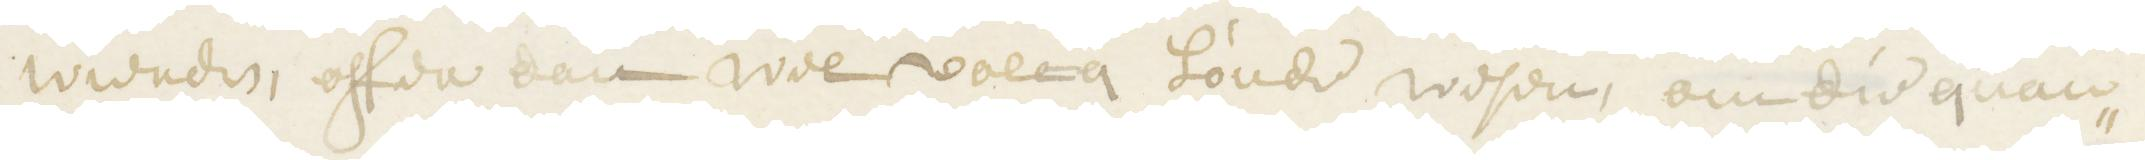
wierden, offer dan wel volcq soude wesen, om die quan„
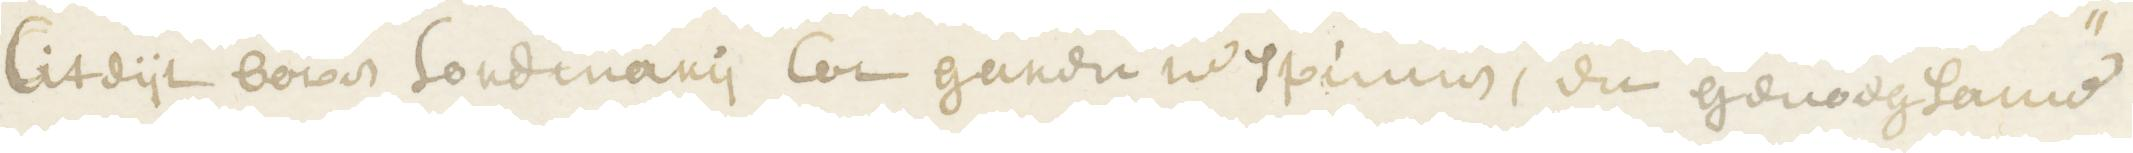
titeijt boven tordinarij tot garen te spinnen, en genoeg same
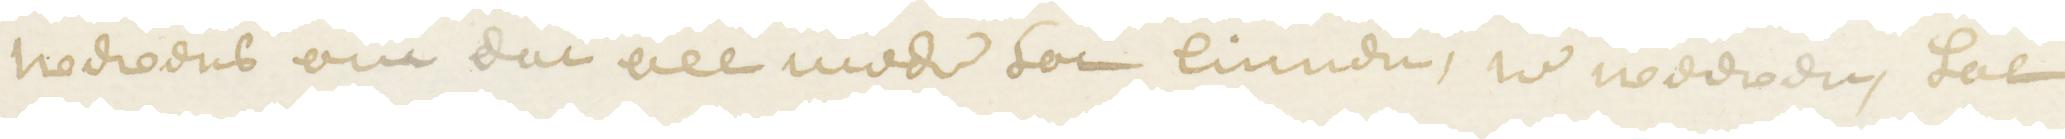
wevers om dat all mede tot linnen, te weeven, sal
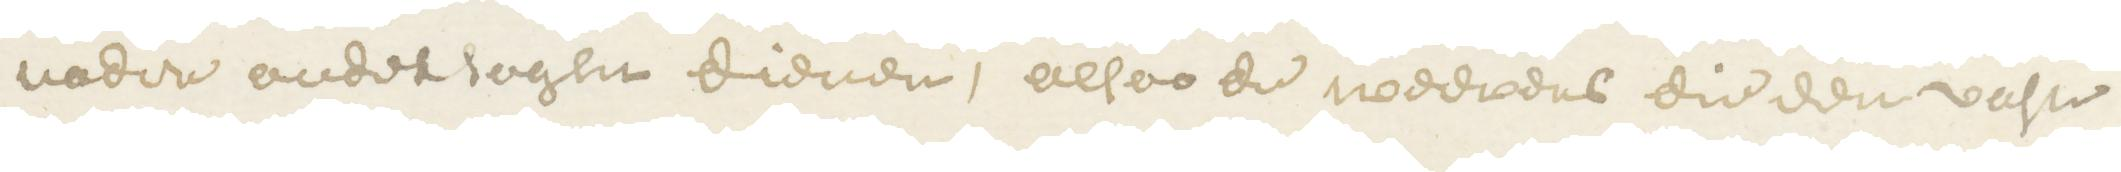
nader ondersoght dienen, alsoo de weevers die een vaste
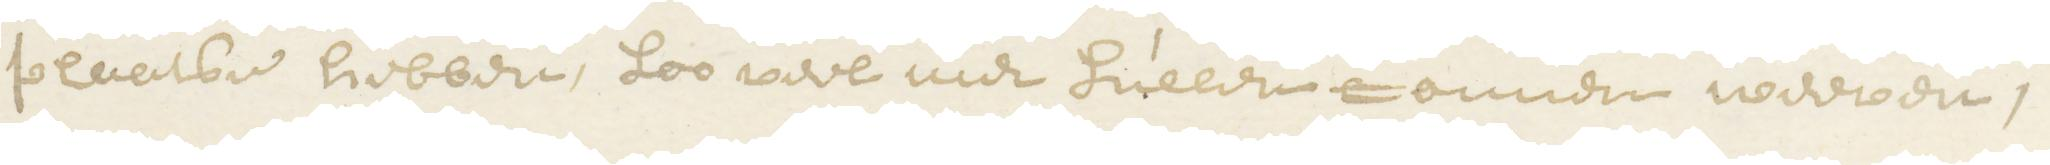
plaatse hebben, soo veel niet sullen connen weeven,
